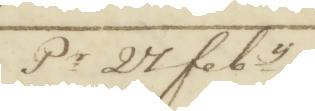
P„r 27 feb=y
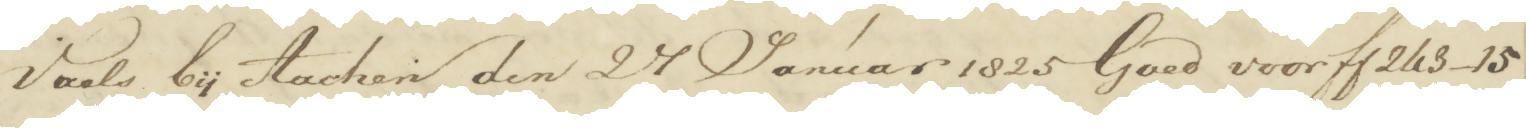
Vaals bij Aachen den 27 Januar 1825 Goed voor ƒf 243–15
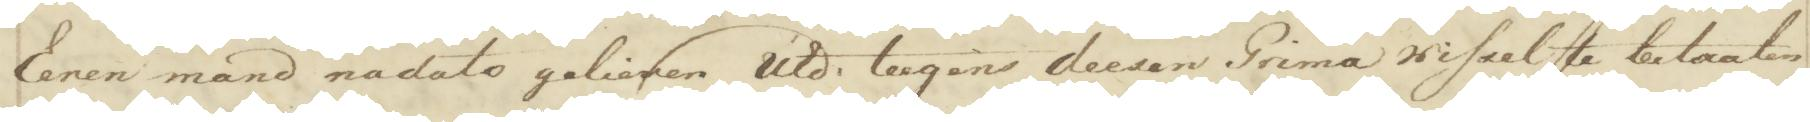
Eenen mand na dato gelieven UEd: teegens deesen Prima wissel te betaalen
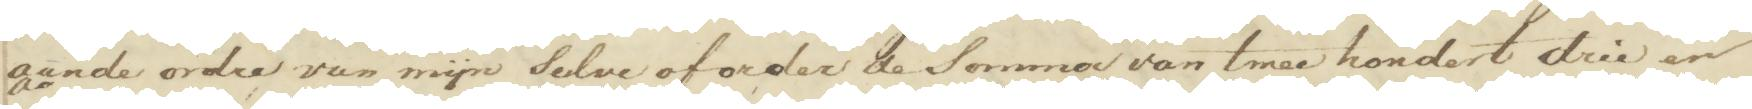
aande ordre van mijn selve of order de somma van twee honderd drie en
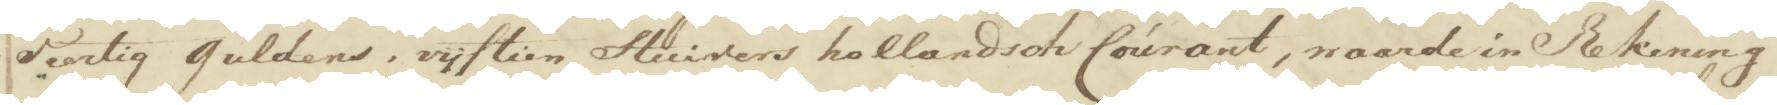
Veertig guldens, vijftien stuivers hollandsch Courant, waarde in Rekening
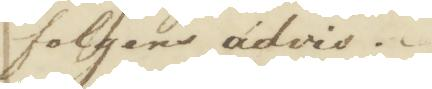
folgens advis.
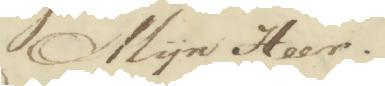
Mijn Heer.
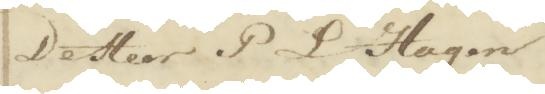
De Heer P L Hagen
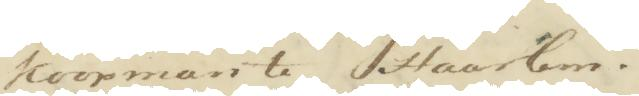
koopman te Haarlem.
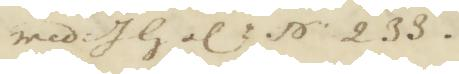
wed: J G & C: No 233
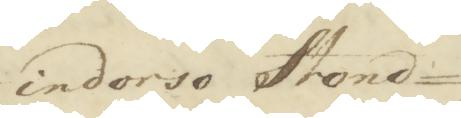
indorso stond=
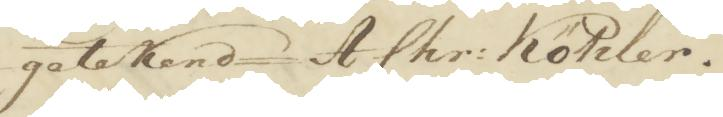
getekend= A Chr: Köhler.
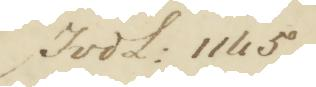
IvdL: 1145
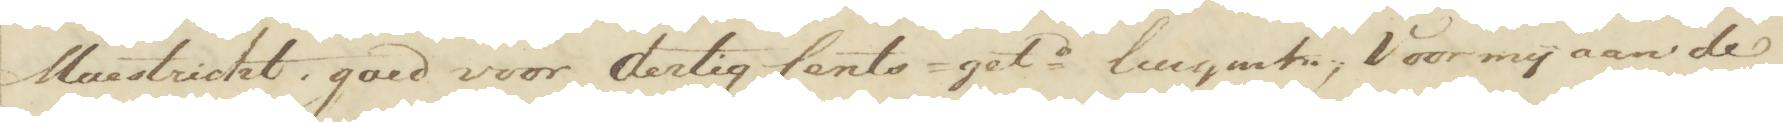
Maestricht, goed voor dertig Cents =get=d luigenting; Voor mij aan de
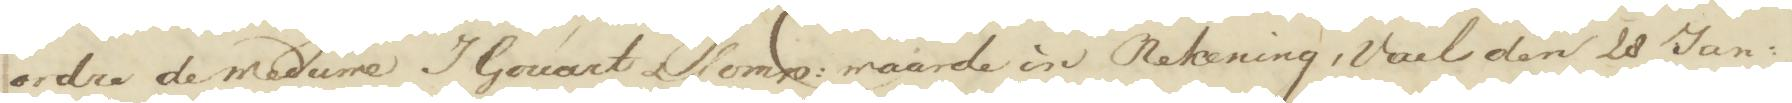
ordre de weduwe I Gouart & Comp: waarde in Rekening, vorleden 28 Ian:
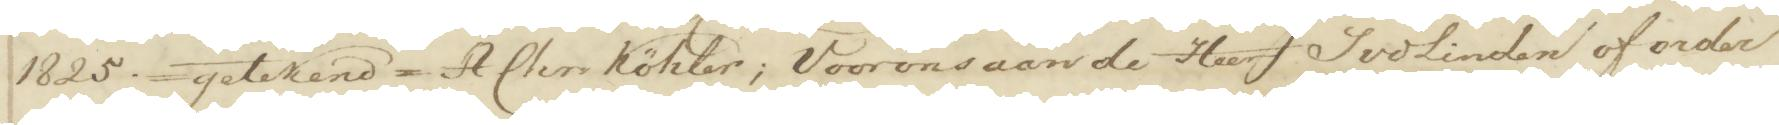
1825.= getekend = A Chr Köhler; Voor ons aan de Heer I vd Linden of order
